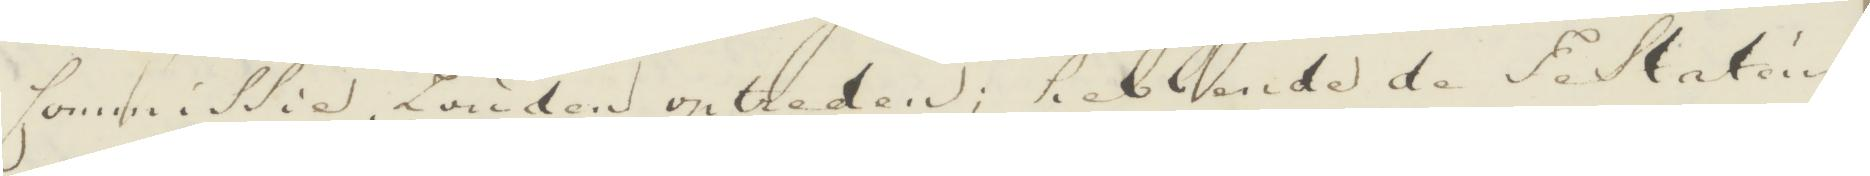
Commissie, zouden optreden hebbende de Testateur
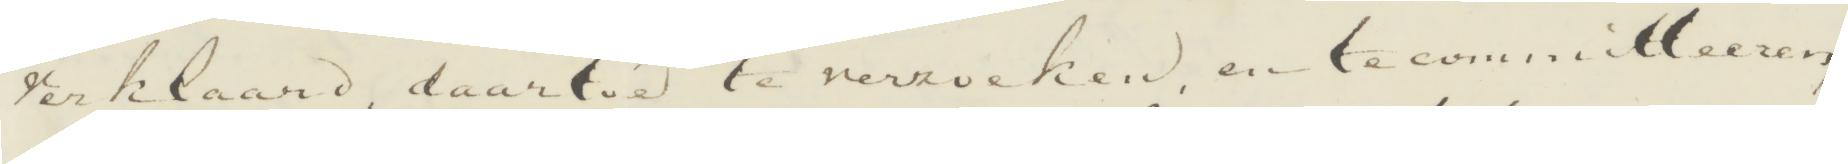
verklaard, daartoe, te verzoeken, en te committeeren,
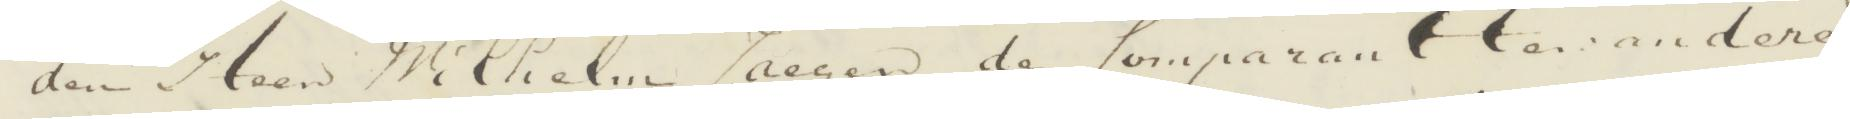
den Heer Wilhelm Jaeger de Comparant ten andere
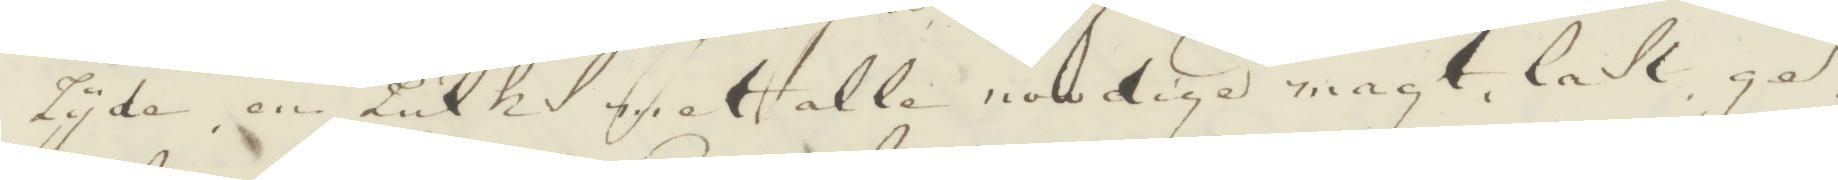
zijde, om zulks met alle noodige magt, last, ge
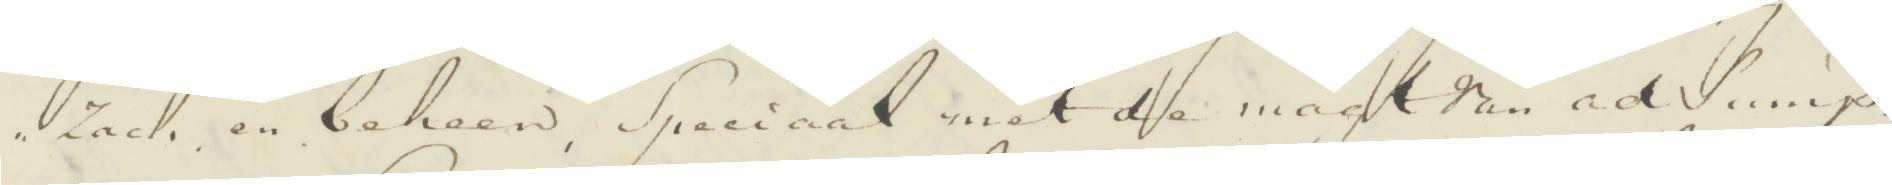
„zach, en beheer, speciaal met de magt van ad sump.
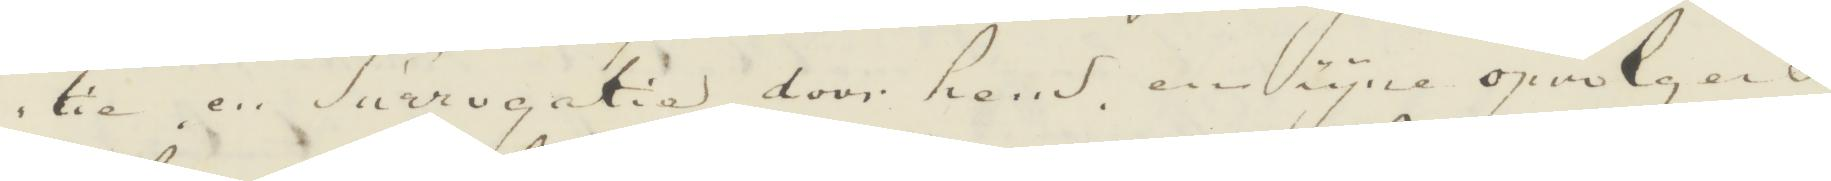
„tie en surrogatie door hem en zijne opvolgers
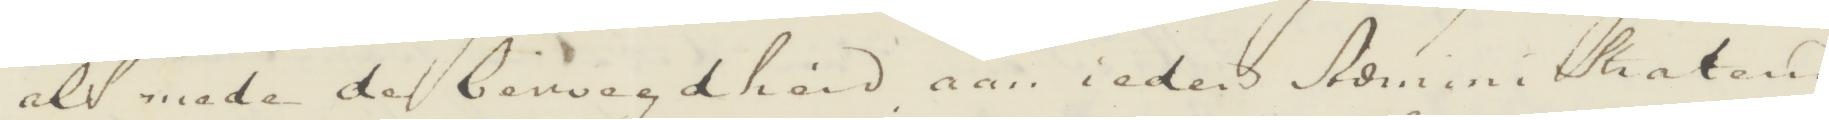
als mede de bevoegdheid, aan ieder Administrateur
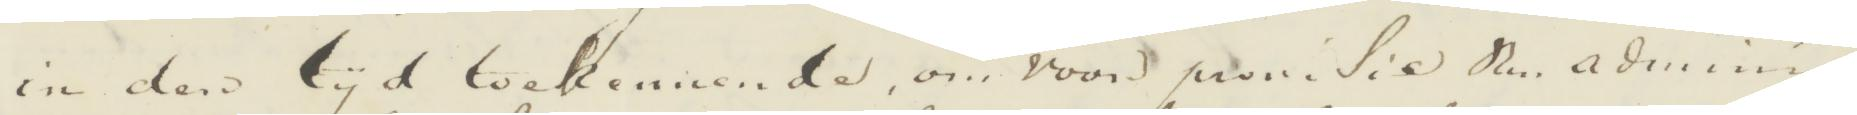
in den tijd toekennende, om voor provisie van admini
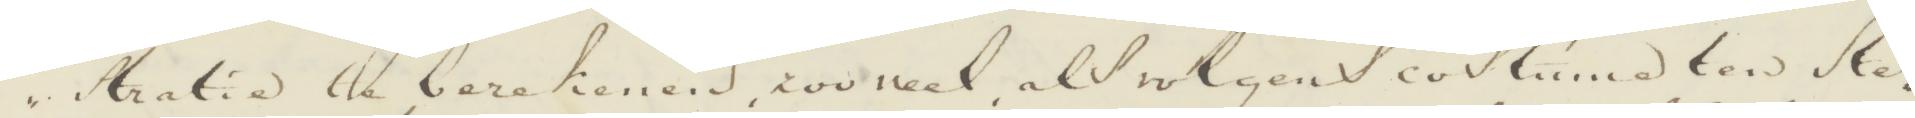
„stratie te berekenen, zoo veel, als volgens costume ten ste„
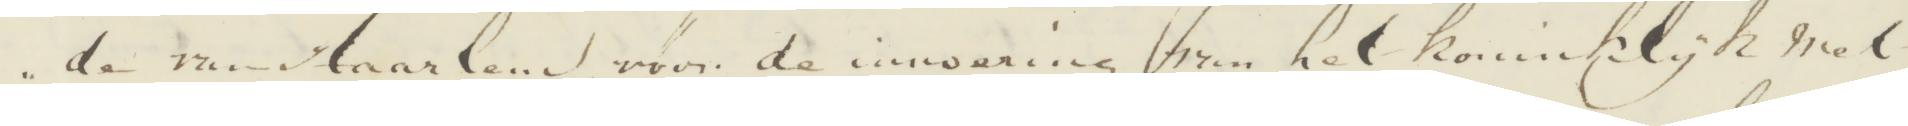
„de van Haarlem, voor de invoering van het koninklijk wet
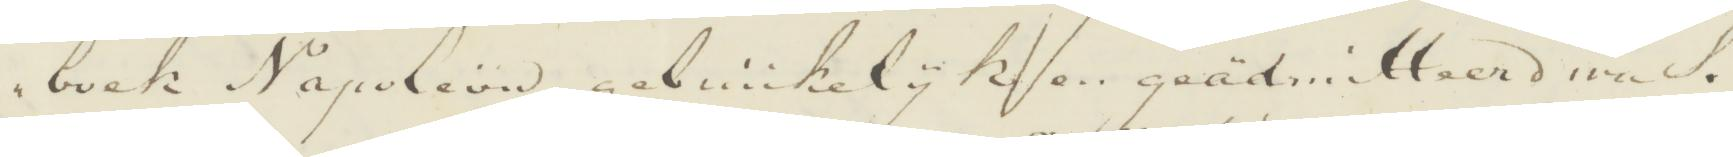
„boek Napoleon gebruikelijk en geädmitteerd was.
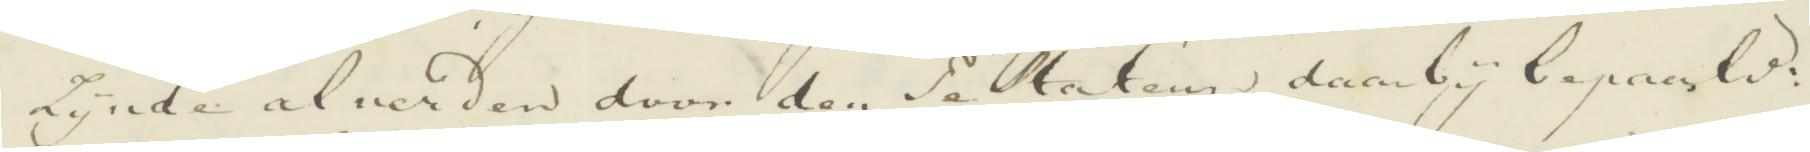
Zijnde al verder door den Testateur daarbij bepaald:
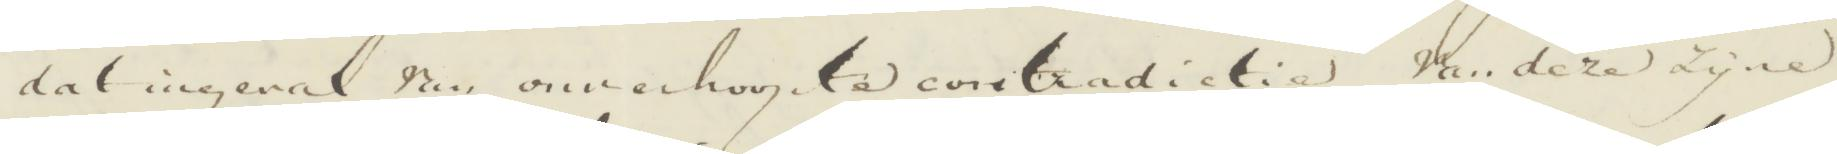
dat ingeval van onverhoopte contradictie, van deze zijne
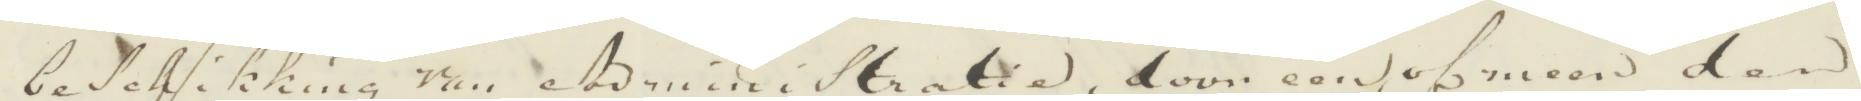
beschikking van Administratie, door één of meer der
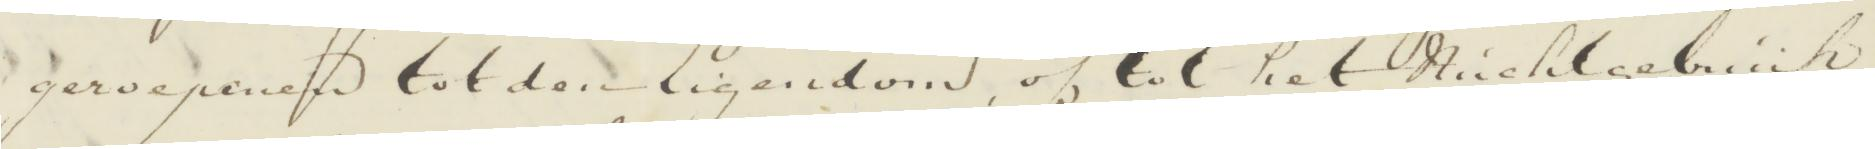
geroepenen tot den Eigendom, of tot het vruchtgebuik
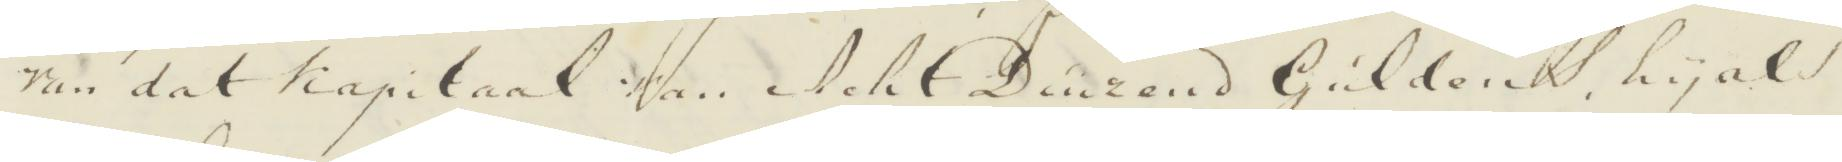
van dat kapitaal van Acht Duizend Guldens, hij als
